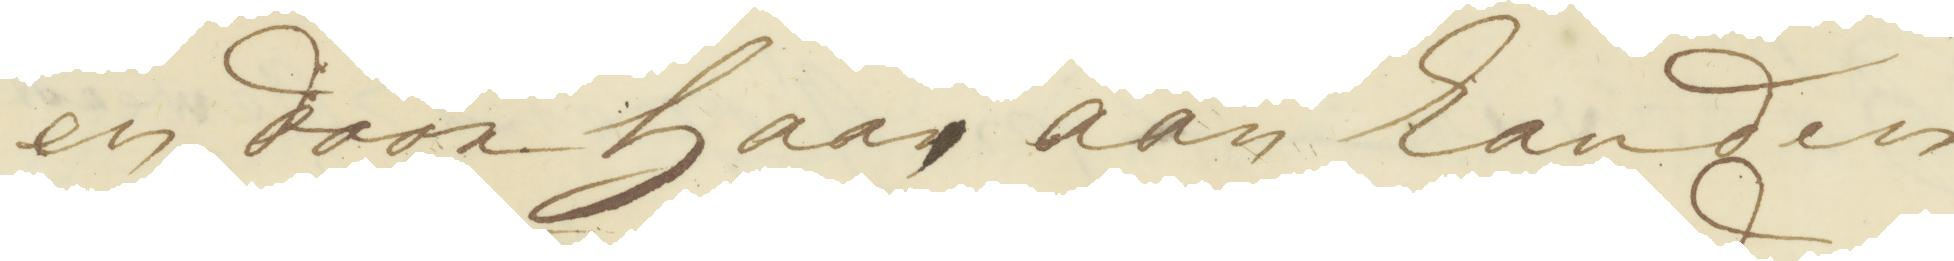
en door haar aan handen
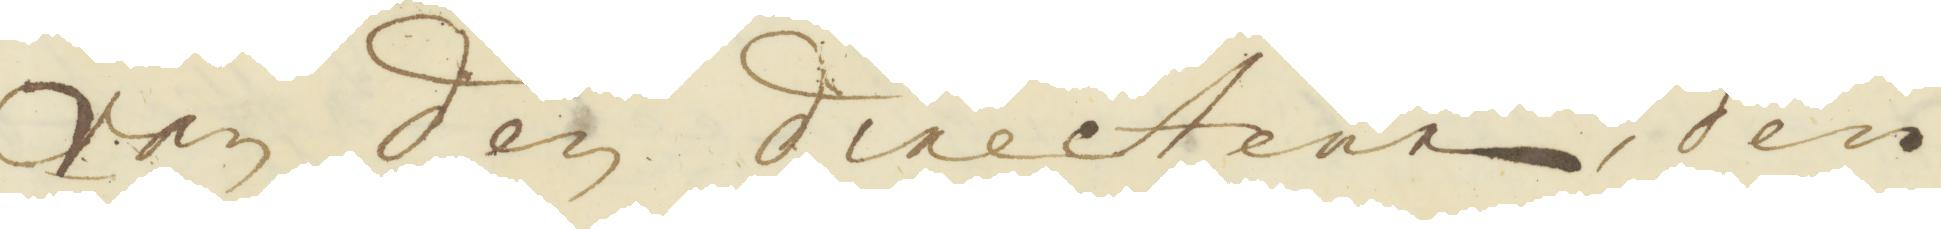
van den directeur, den
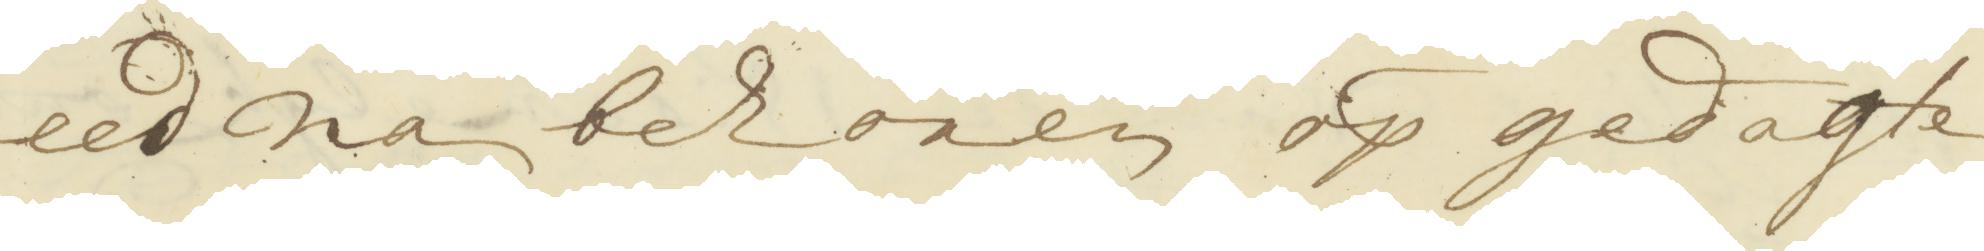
eed na behoren op gedagte
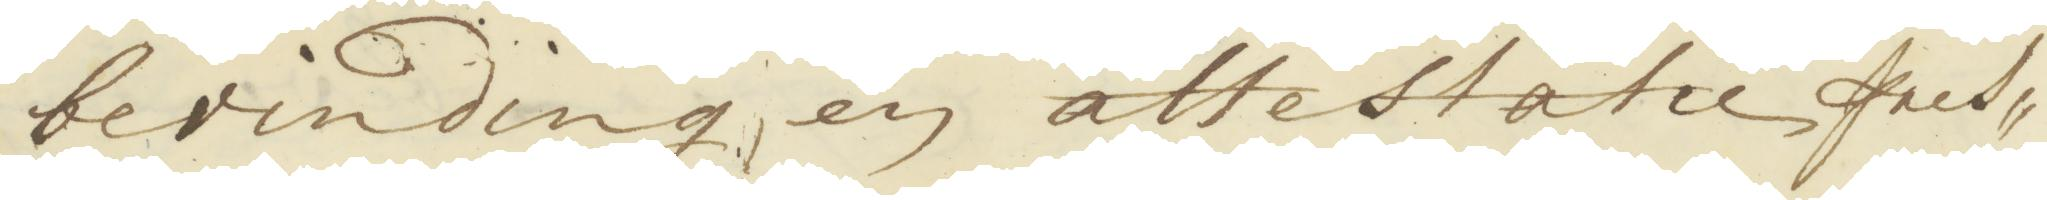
bevinding, en attestatie Pres„
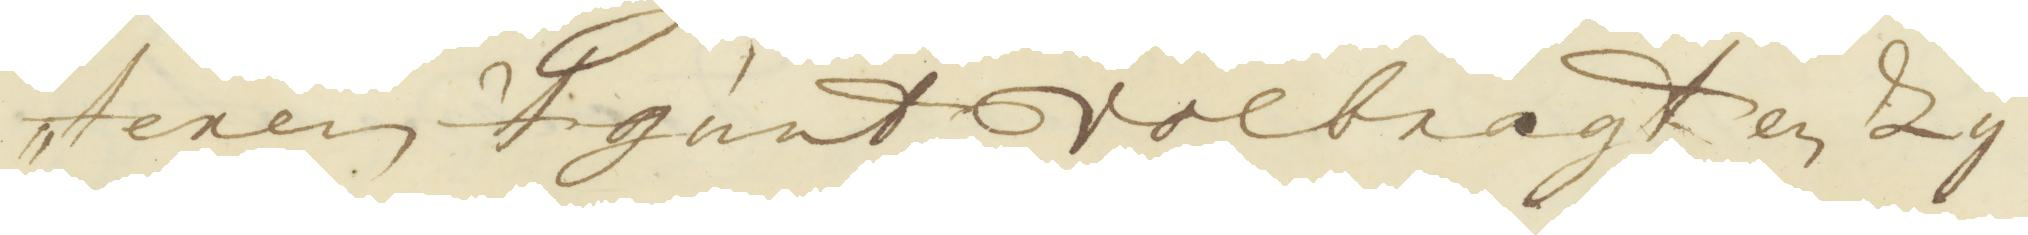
„teren 't gunt volbragt en zij
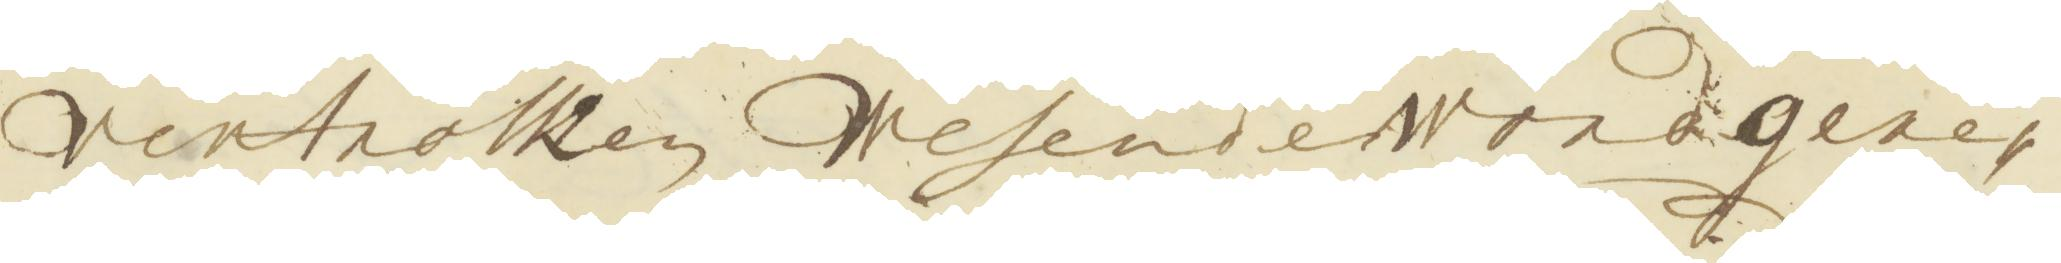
vertrokken Wesende word gere
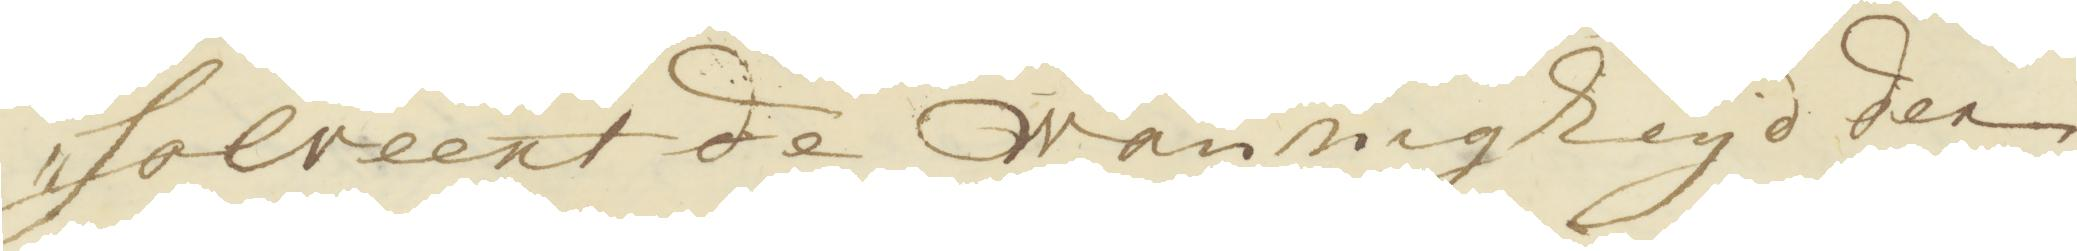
„solveert de wannigheijd der
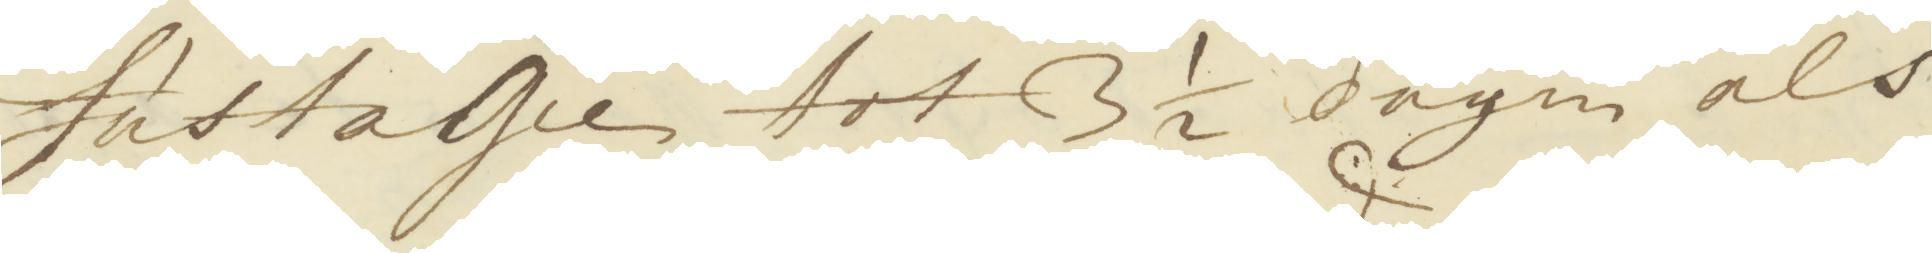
sustagie tot 3½ duijm als
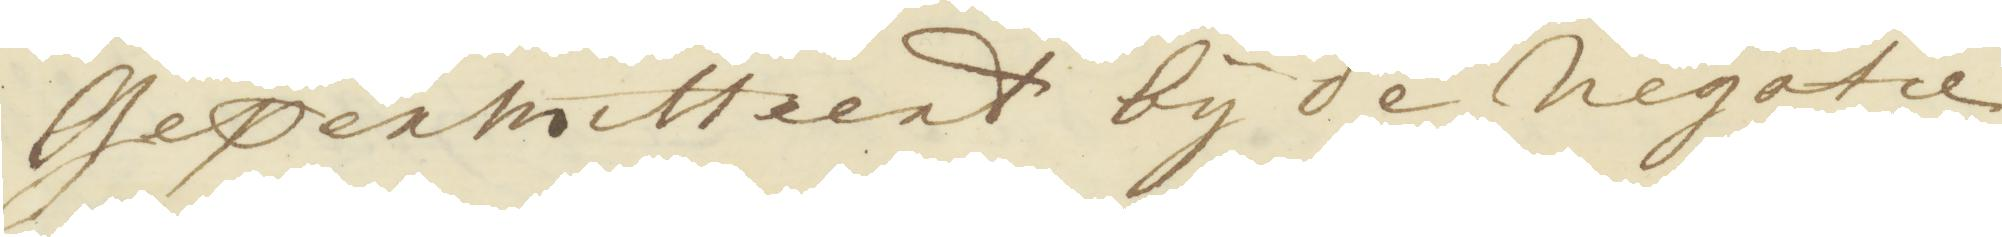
Gepermitteert bij de Negotie
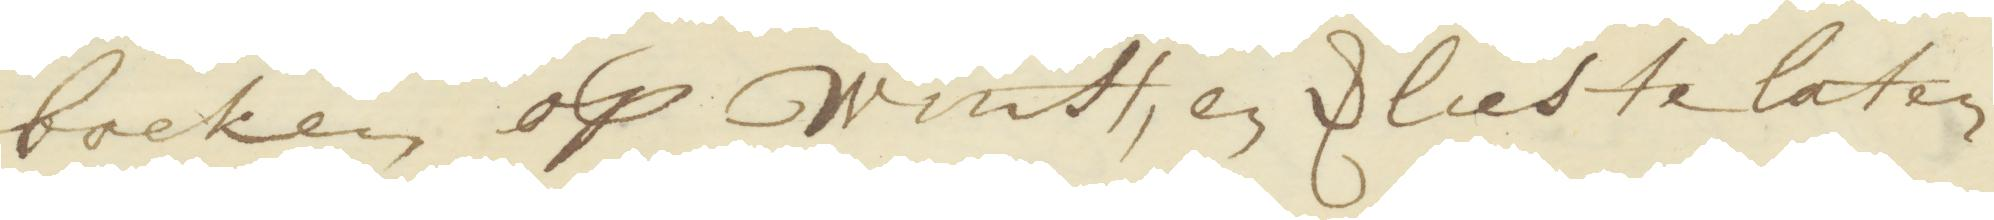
boeken op winst, en verlies te laten
